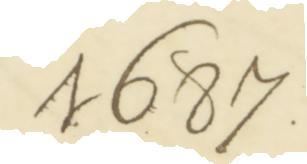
1687
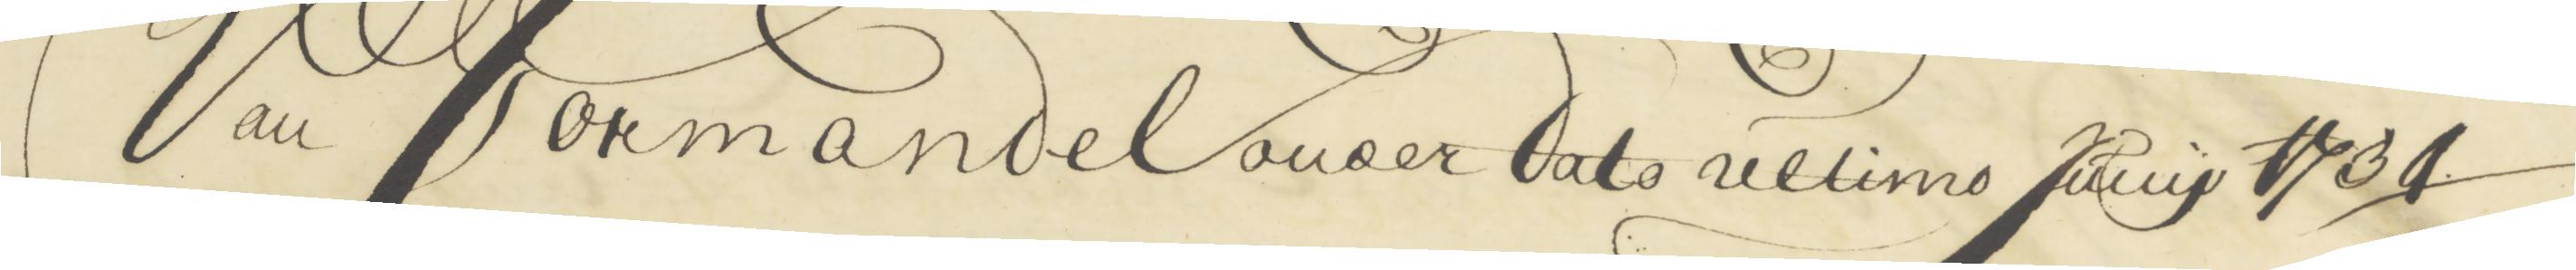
Van Cormandel onder dato ultimo Junij 1734.
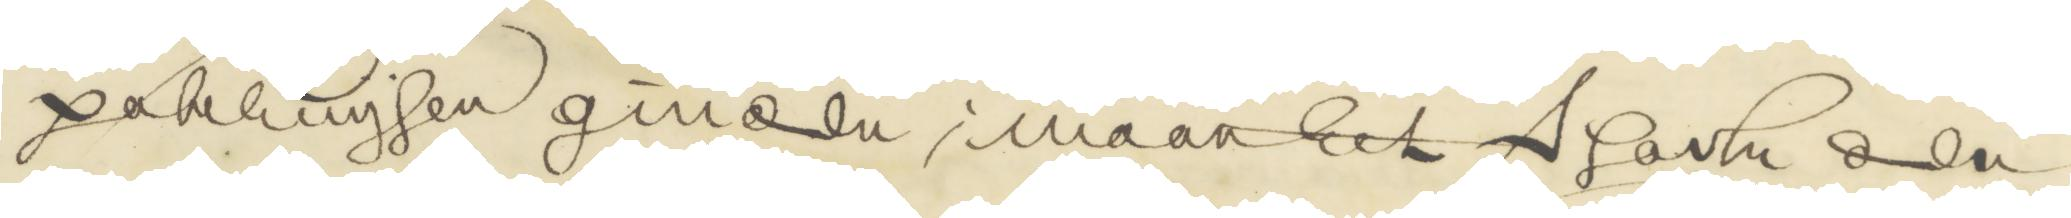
pakhuijsen ginder; maar het versoek den
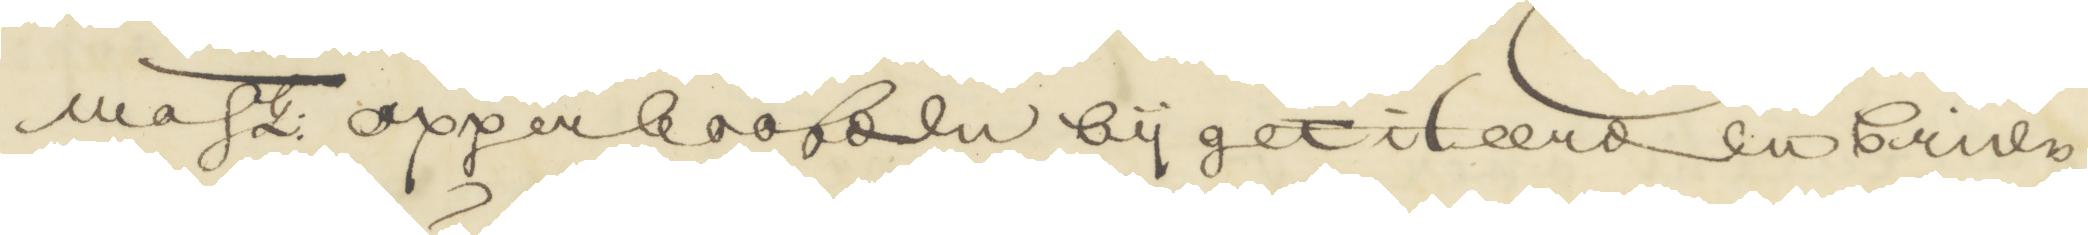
masz: opperhoofden bij geciteerden briev
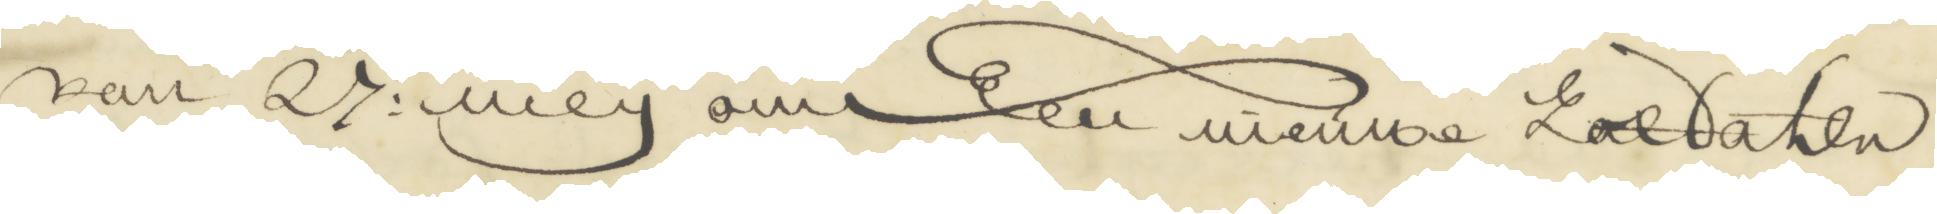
van 27:' meij om Een nieuwe zaldaten
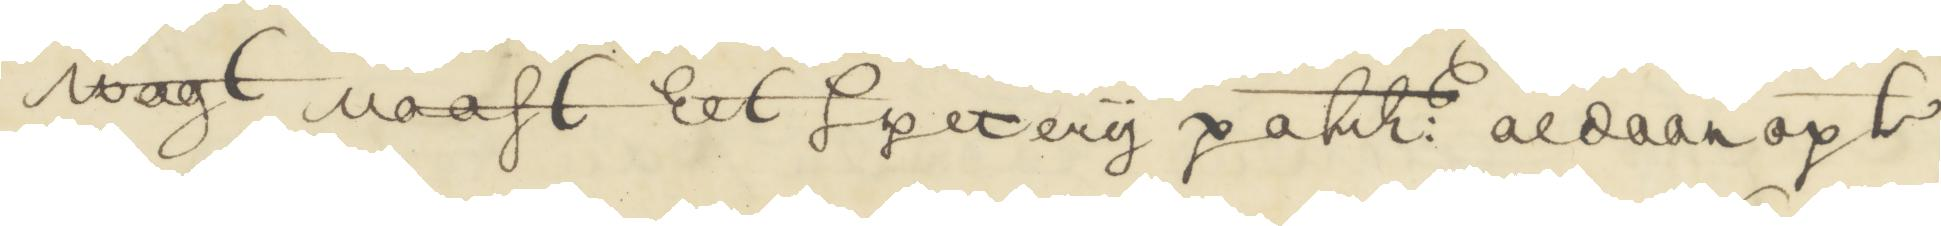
wagt naast het specerij pakh:s aldaar op te
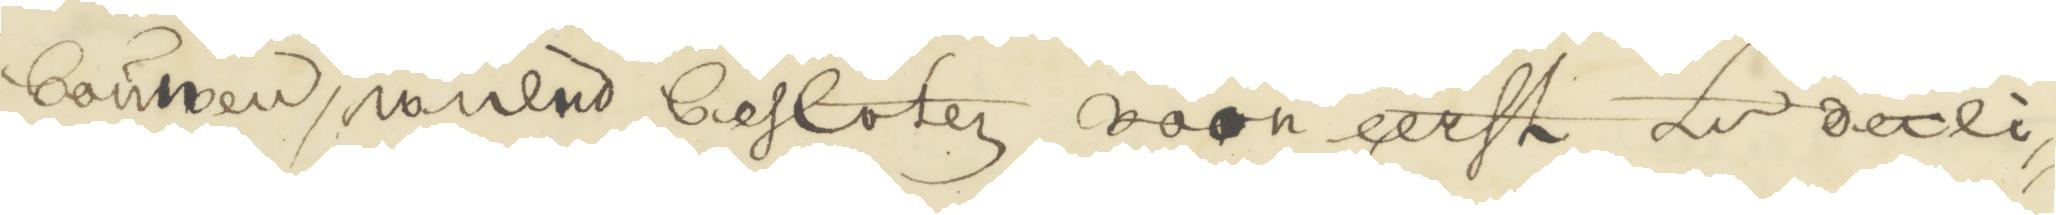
bouwen, wierd besloten voor eerst te decli„
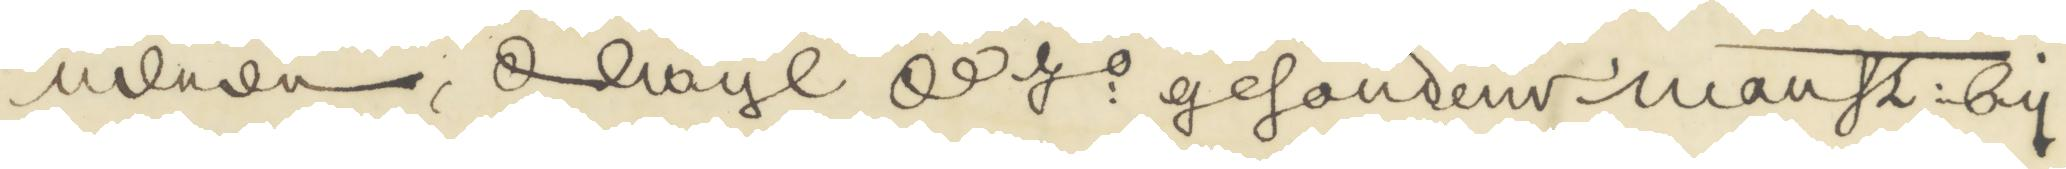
neren; dewijl de I:o gesondene mansz: bij
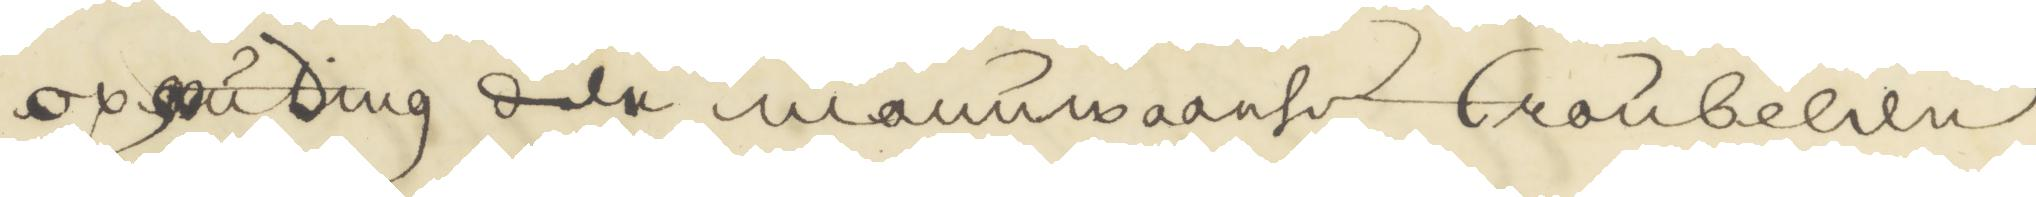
opgouding der manuwaarse troubelen
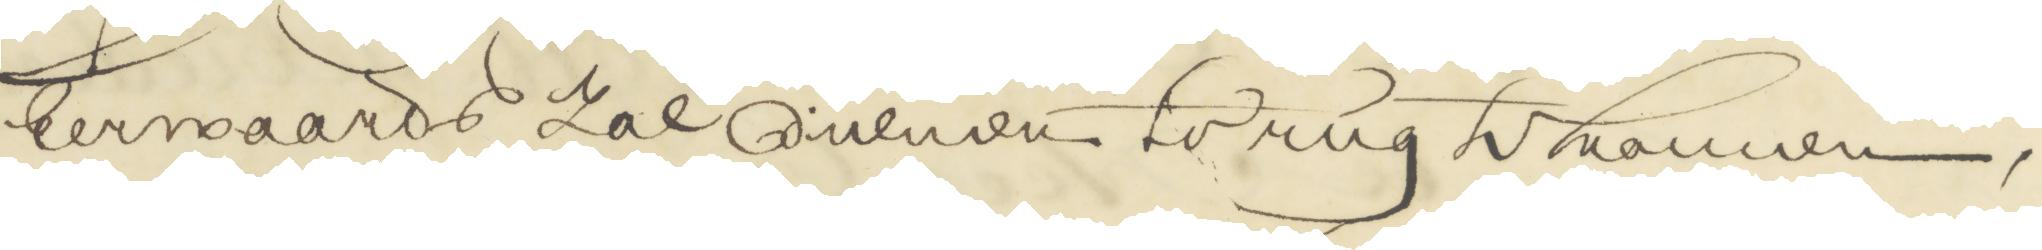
herwaards zal dienen te rug te komen,
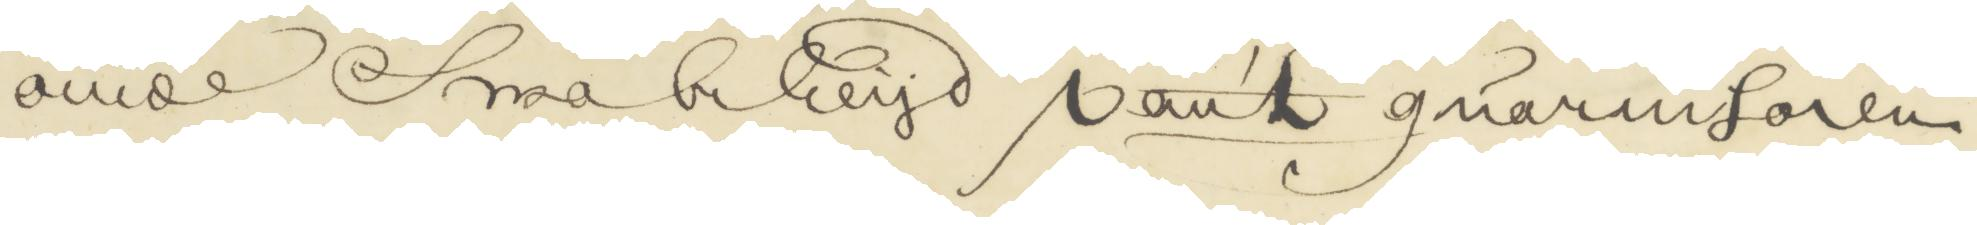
omde Swakheijd van ’t guarnisoen
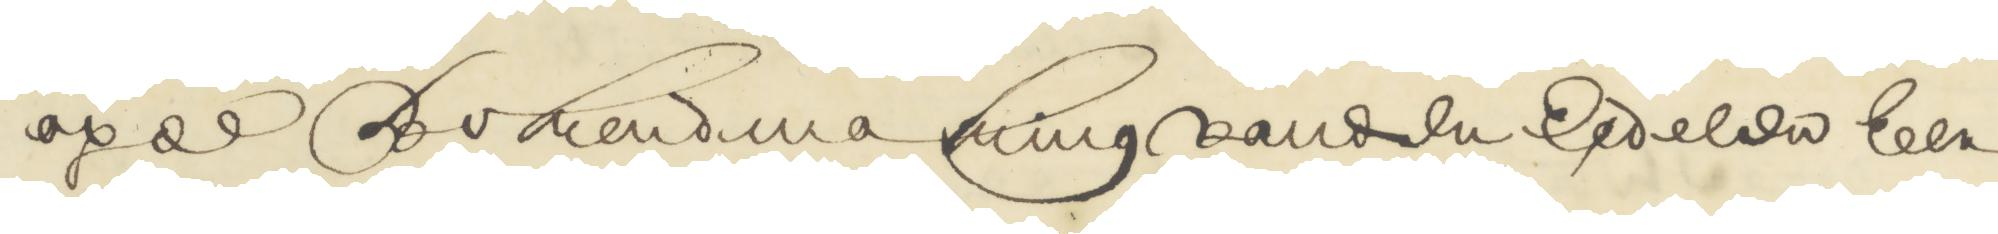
op de bekendmaking van den Eedelen heer
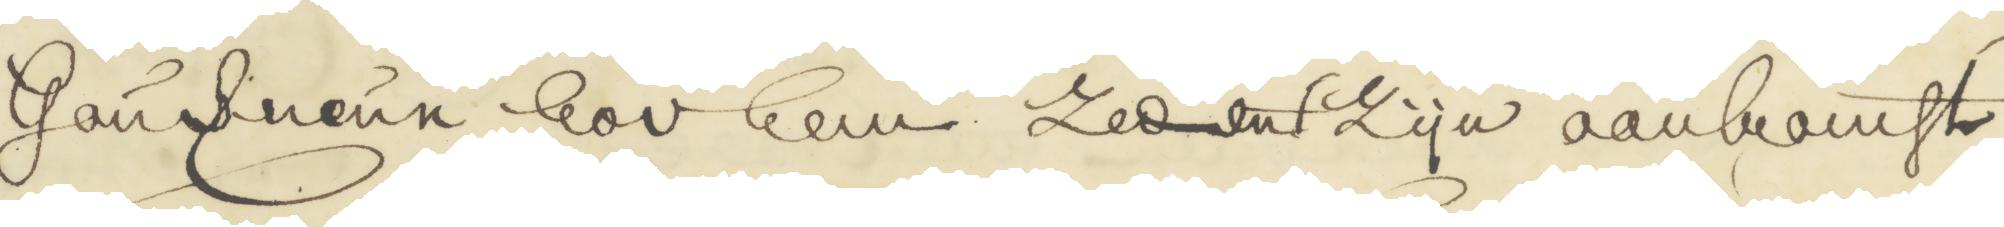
Gouverneur hoe hem zedert zijn aankomst
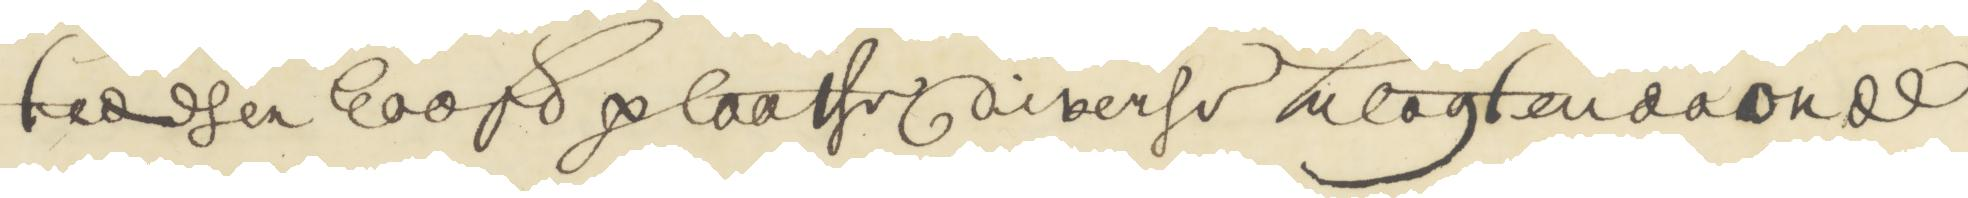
te deser hoofd plaatse diverse klagten door de
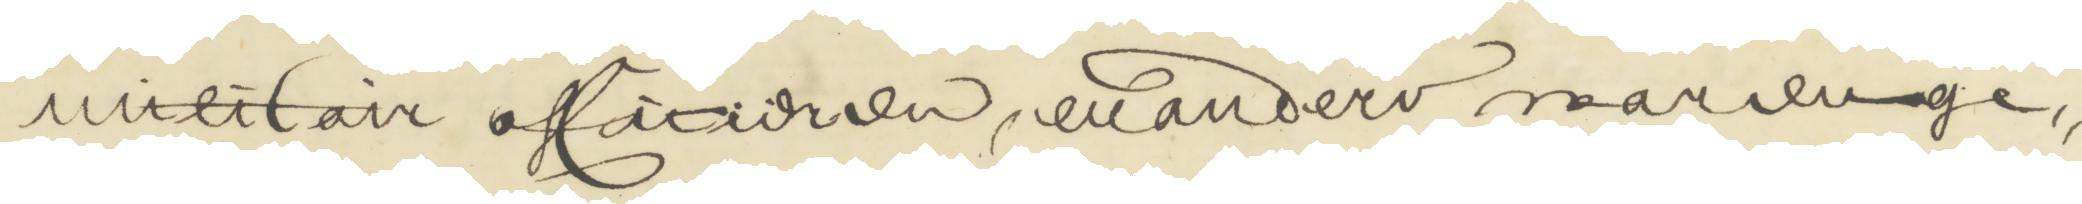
militair officieren, en andere waren ge„
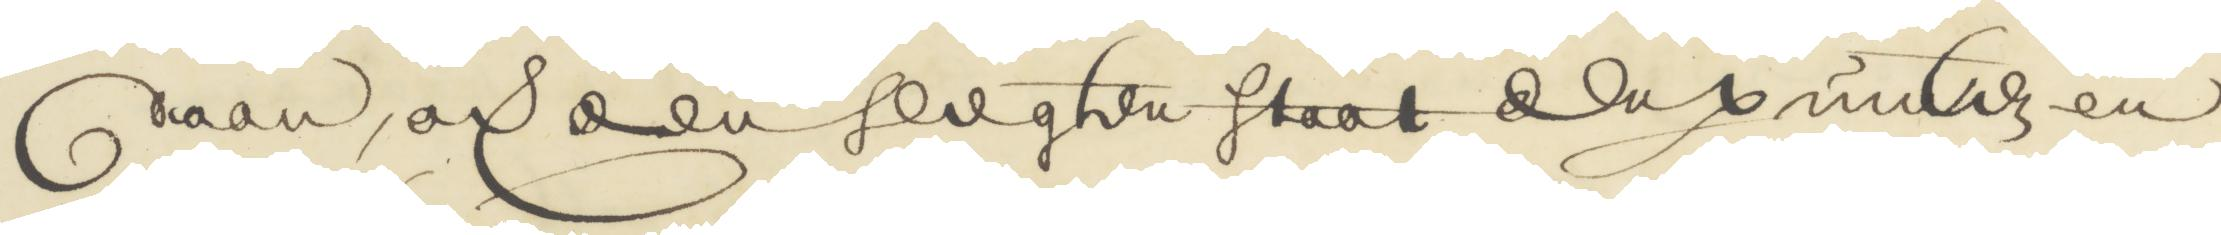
daan, over den slegten staat der punten en
